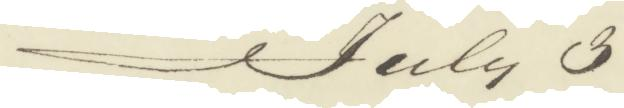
July 3
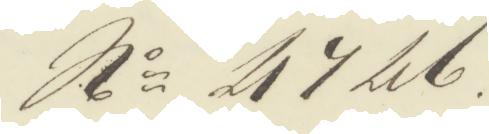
N=o 4746
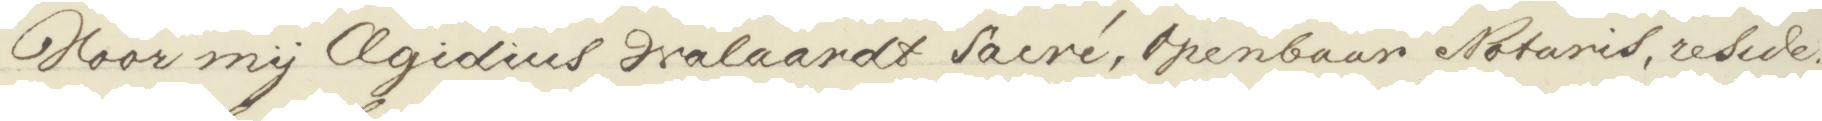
Voor mij AEgidius Walaardt sacré, openbaar Notaris, reside
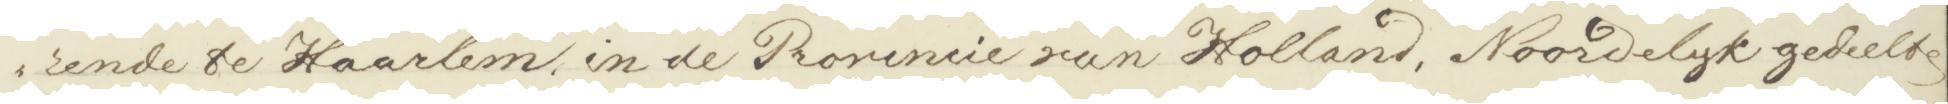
„rende te Haarlem, in de Provincie van Holland, Noordelyk gedeelte
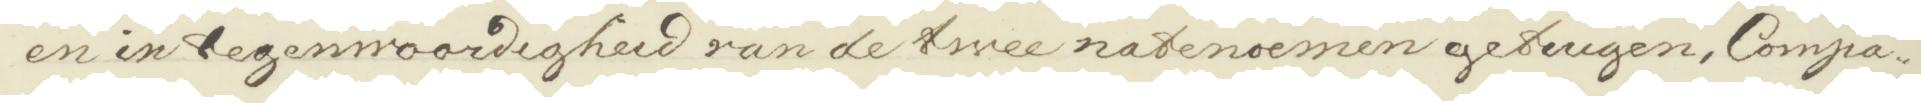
en in tegenwoordigheid van de twee natenoemen getuigen, Compa„
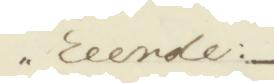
„reerde:
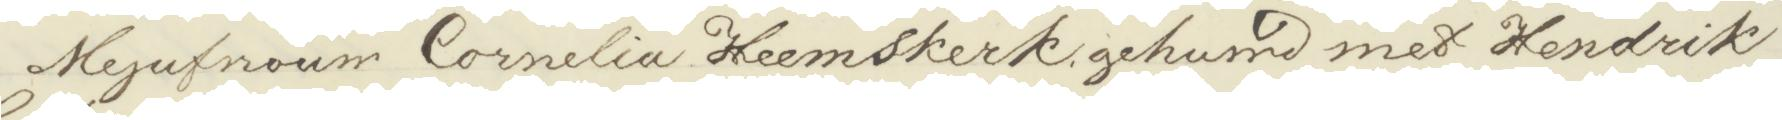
Mejufvrouw Cornelia Heemskerk, gehuwd met Hendrik
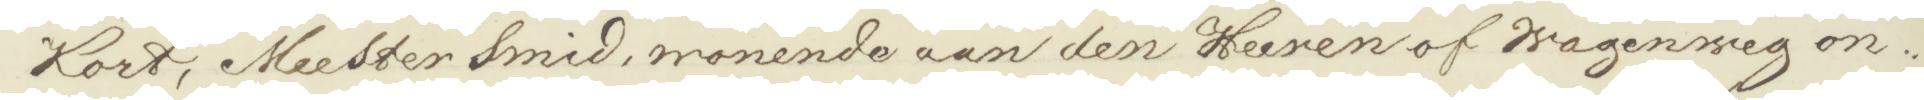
Kort; Meester Smid, wonende aan den Heeren of Wagenweg on
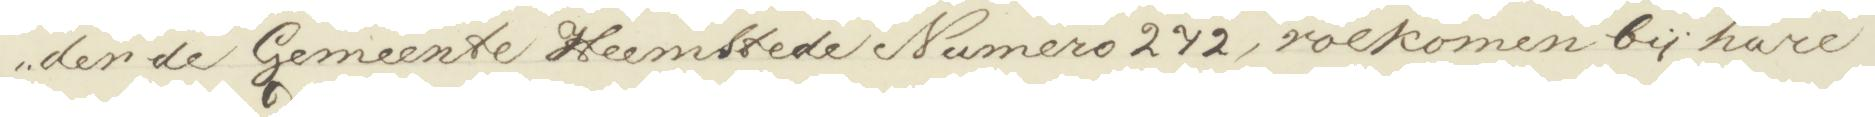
„der de Gemeente Heemstede Numero 272, volkomen bij hare
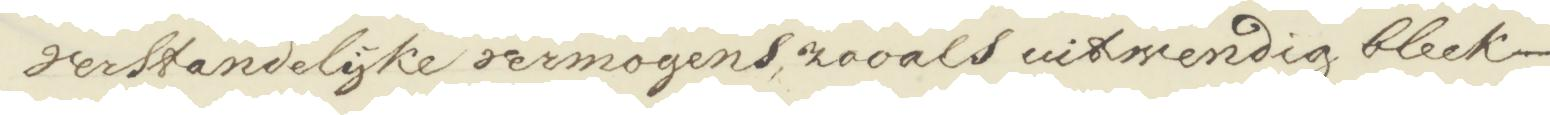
verstandelijke vermogens, zooals uitwendig bleek
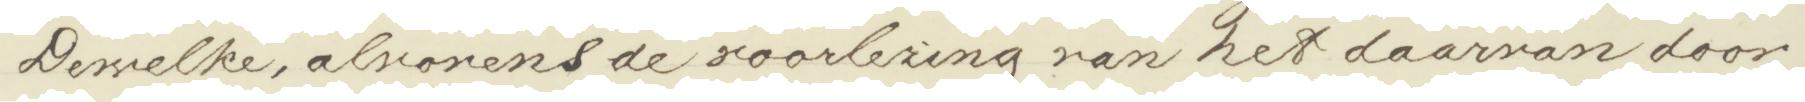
Dewelke, alvorens de voorlezing van het daarvan door
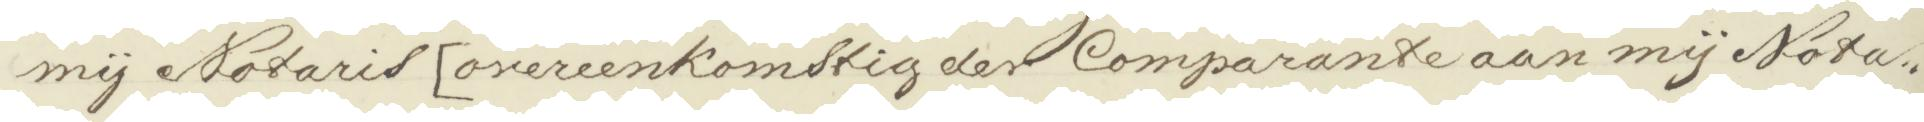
mij Notaris [overeenkomstig der Comparante aan mij Nota„
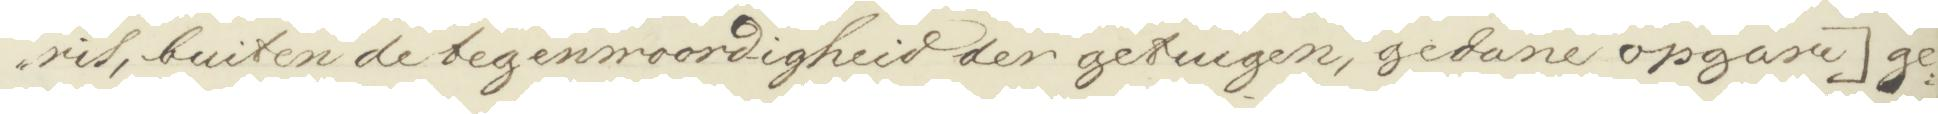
„ris, buiten de tegenwoordigheid der getuigen, gedane opgave] ge
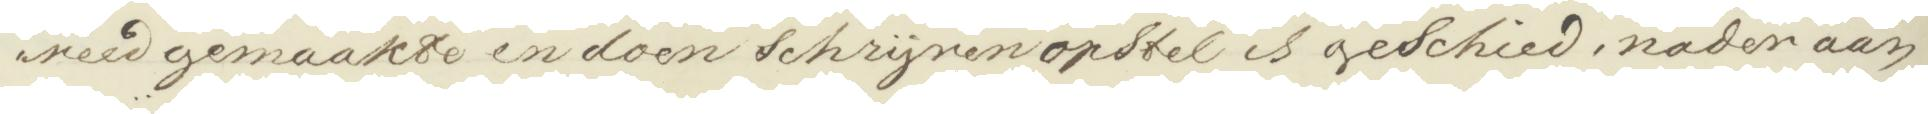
reed gemaakte en doen schrijven opstel is geschied, nader aan
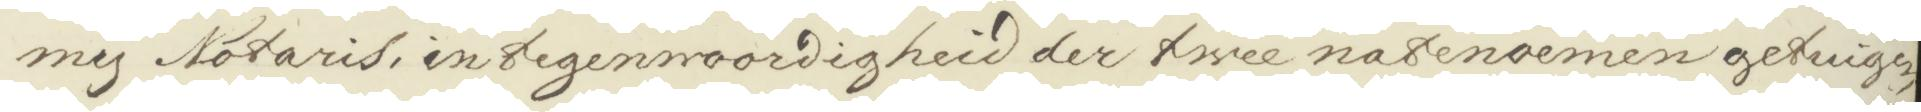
mij Notaris, in tegenwoordigheid der twee natenoemen getuigen,
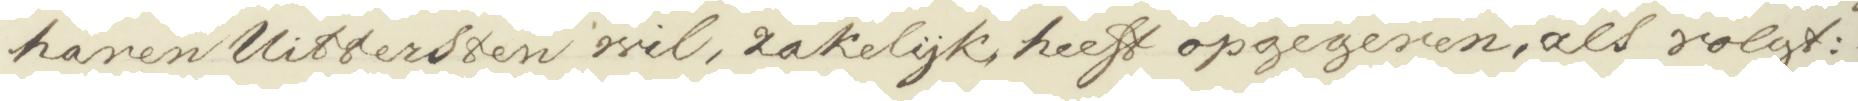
haren Uittersten wil, zakelijk, heeft opgegeven, als volgt:
